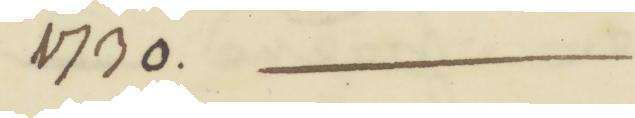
1730. —
